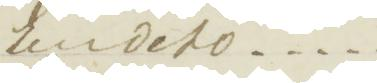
Een dito . . . .
